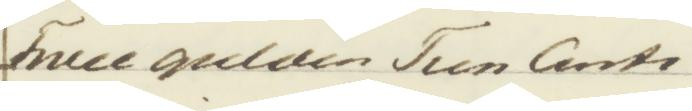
Twee gulden Tien Cents
